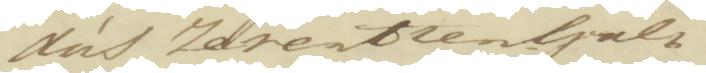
dus Zeventien Gul
